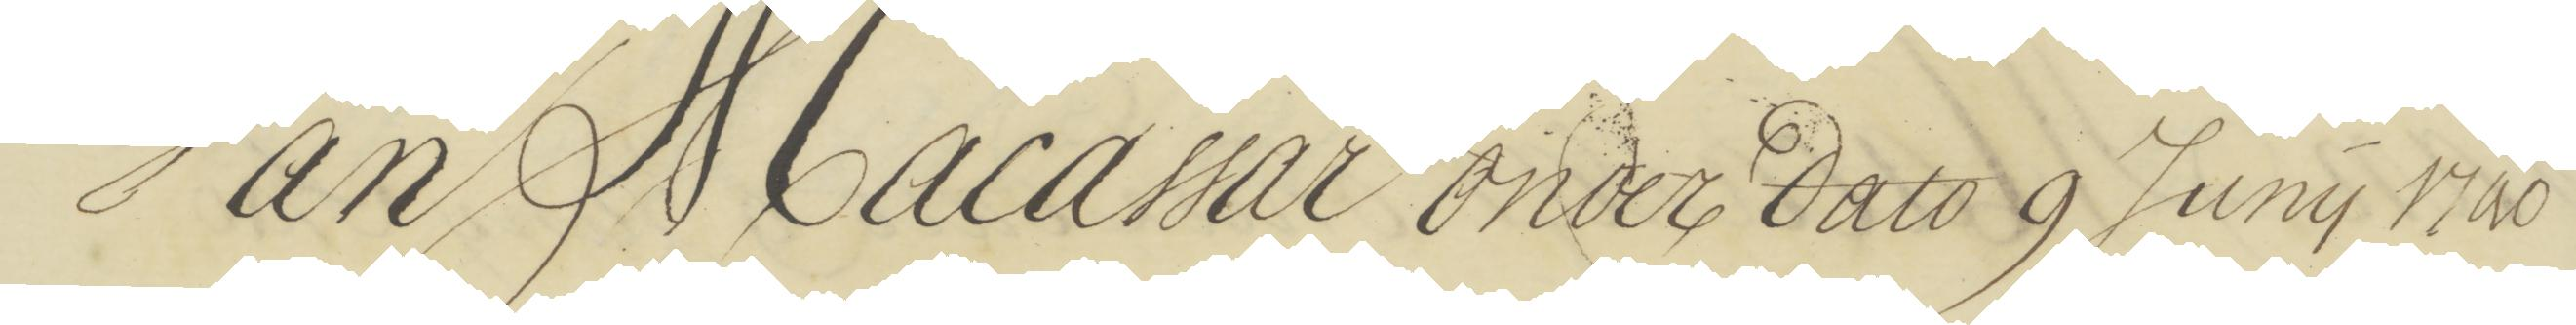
Van Macassar onder dato 9 Junij 1740
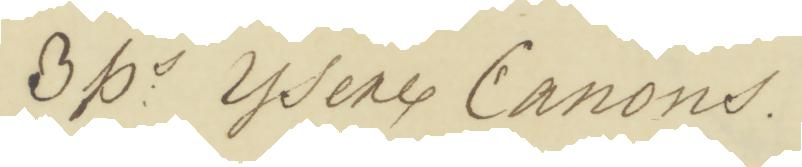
3 p:s ysere Canons.
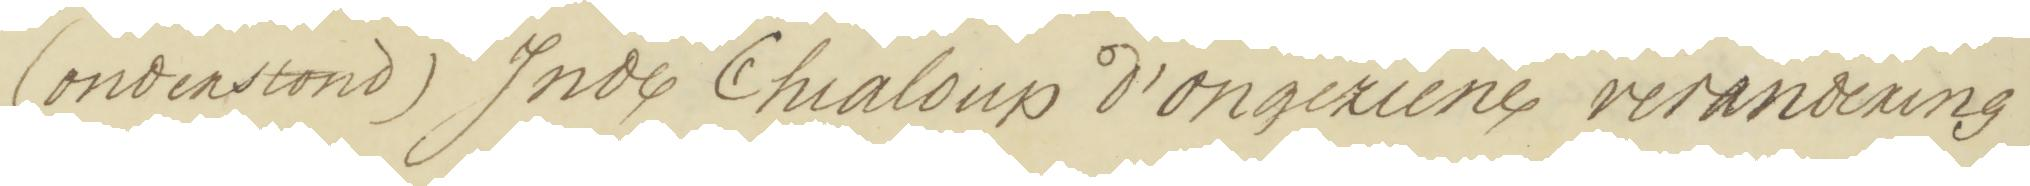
(onderstond) Jnde Chialoup d’ ongeziene verandering
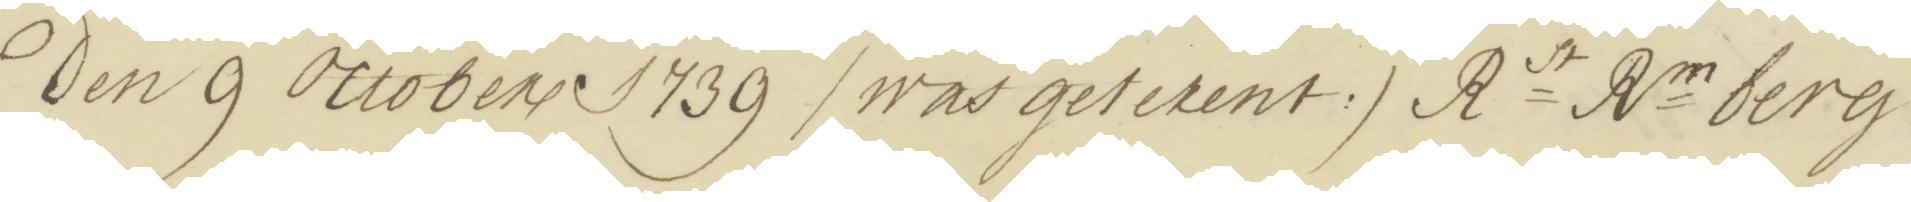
den 9 October 1739 / was getekent:/ R=st R=m berg
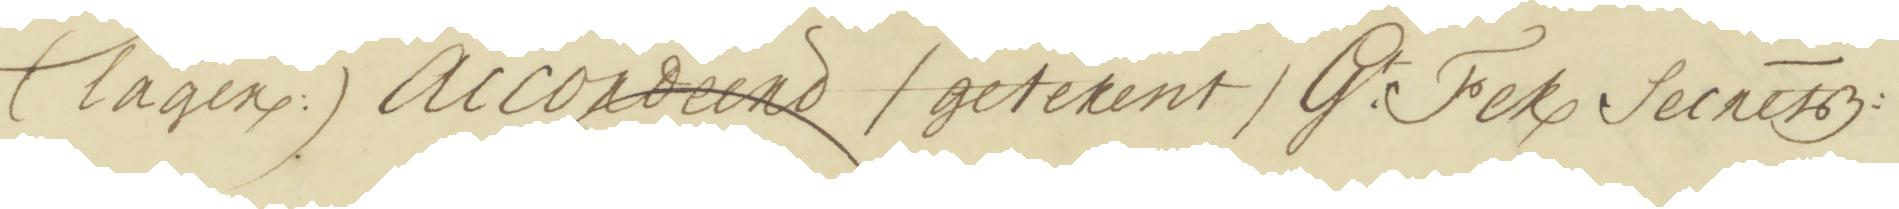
(lager:) accordeerd / getekent / G:t Fek Secrets:
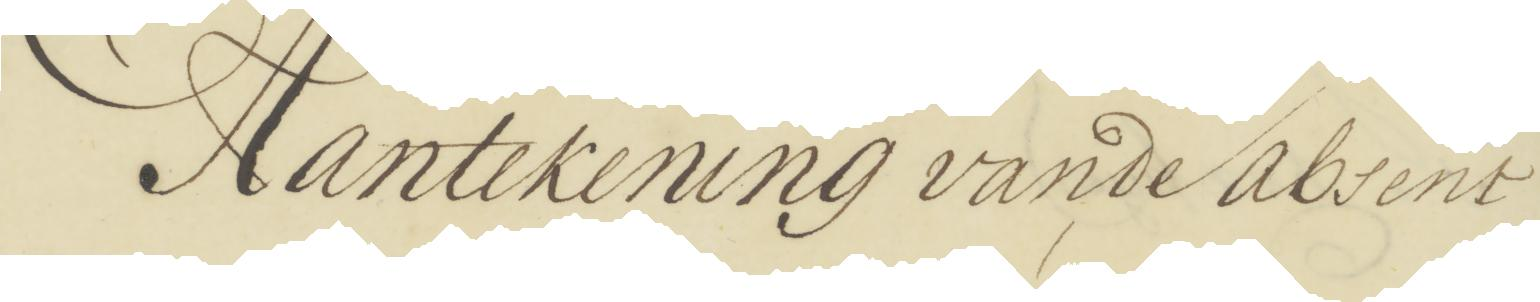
Aantekening van de absent
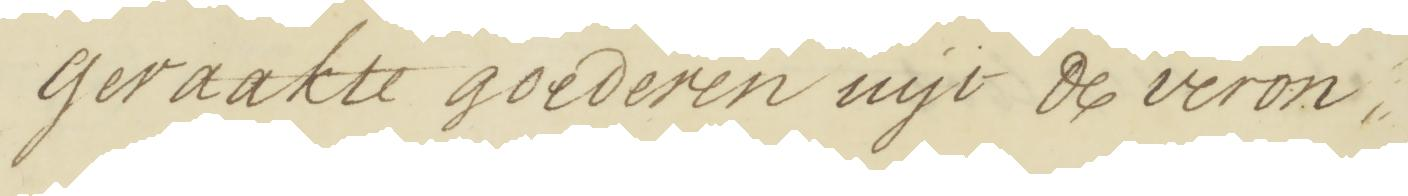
geraakte goederen uijt de veron„
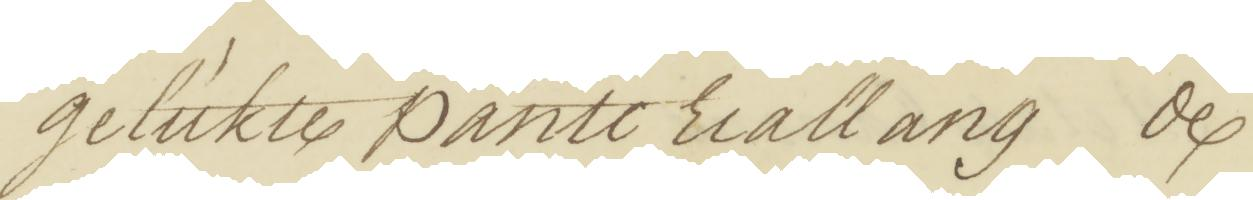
gelukte pantchiallang de
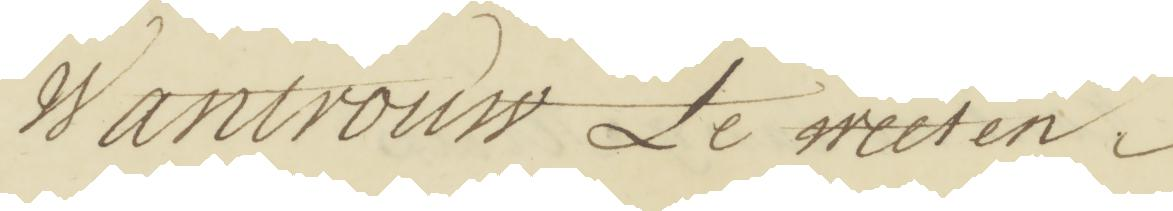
Wantrouw te weeten —
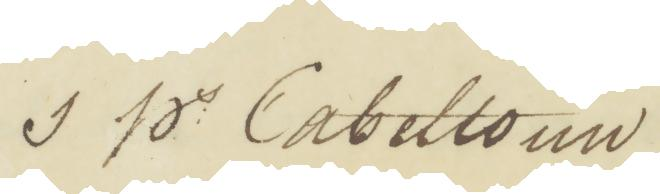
1 p:s Cabeltouw
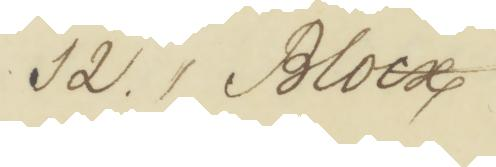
12. „ Blocx
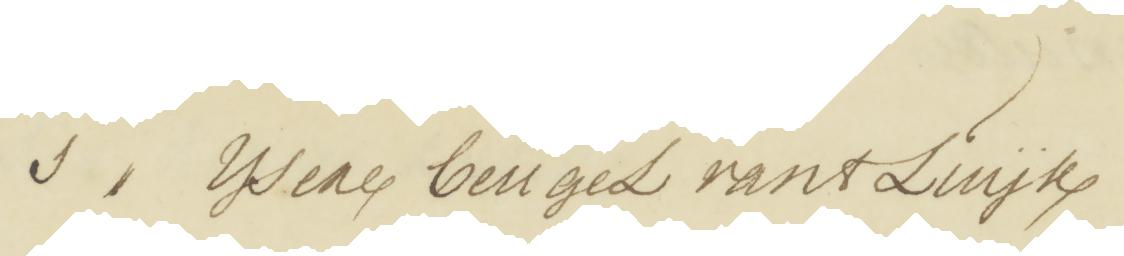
1 „ ysere beugel vant Luijk
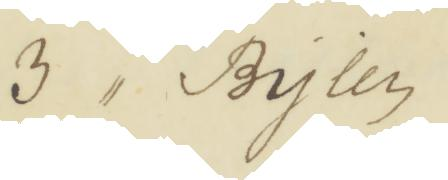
3 „ Bijlen
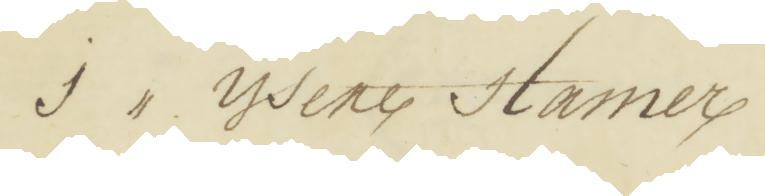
1 „ ysere Hamer
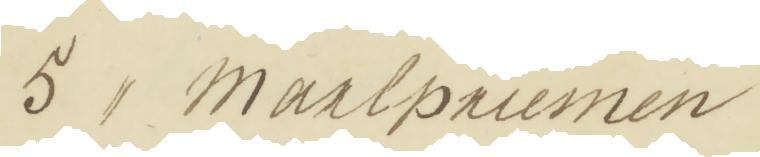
5 „ marlpriemen
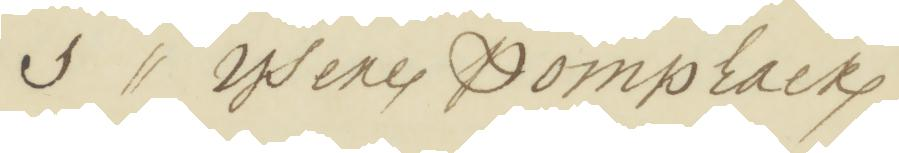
3 „ ysere Pomphaek
